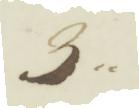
3 „ —
